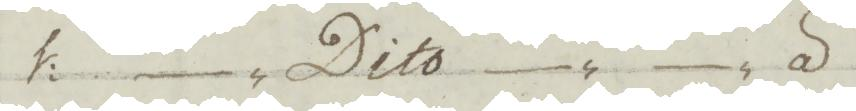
1: —„ Dito —„ —„ a
